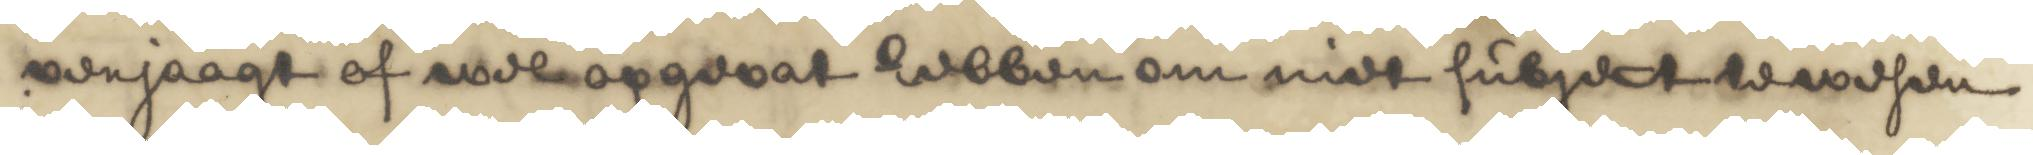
verjaagt of wel op gevat hebben om niet subject te wesen
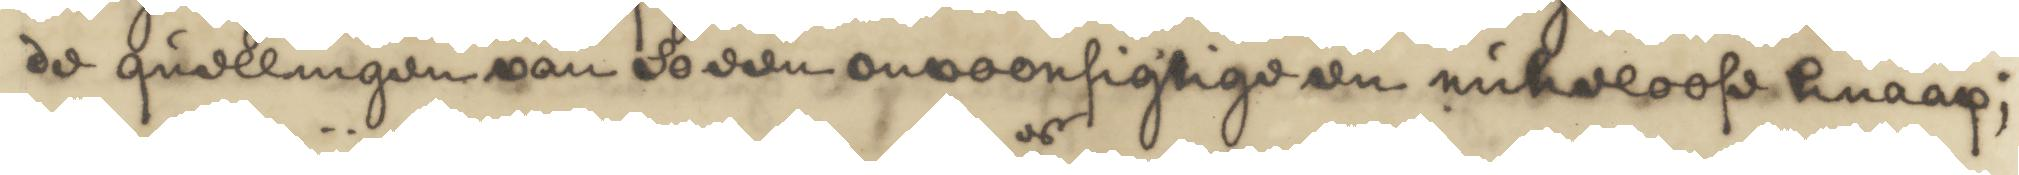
de quellingen van so een onvoorsigtige en rukeloose knaap;
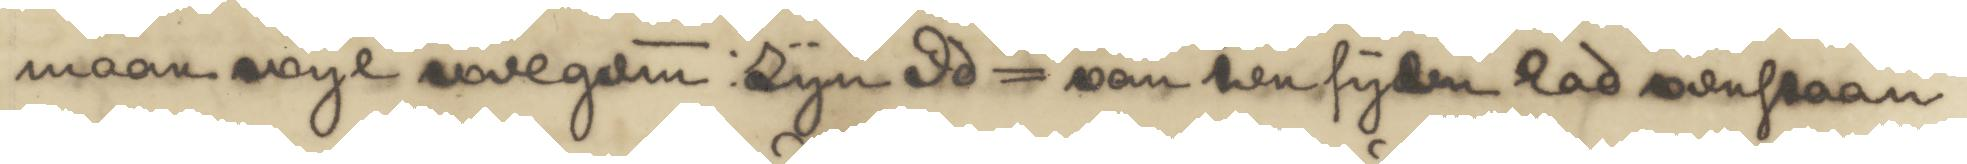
maar wijl welgem: zijn Ed=es van ter sijden had verstaan
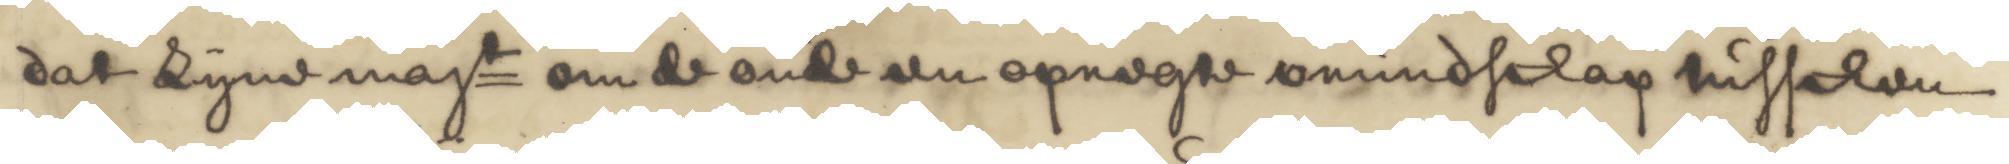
dat zijne maj=t om de oude en opregte vrundschap tusschen
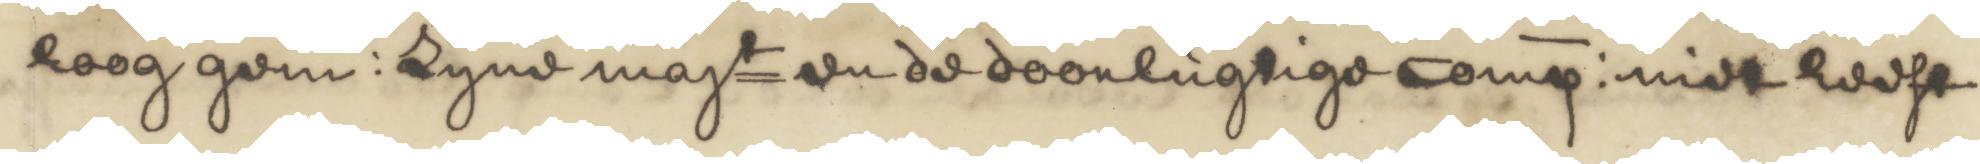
hoog gem: zijne maj=t en de doorlugtige comp: niet heeft
